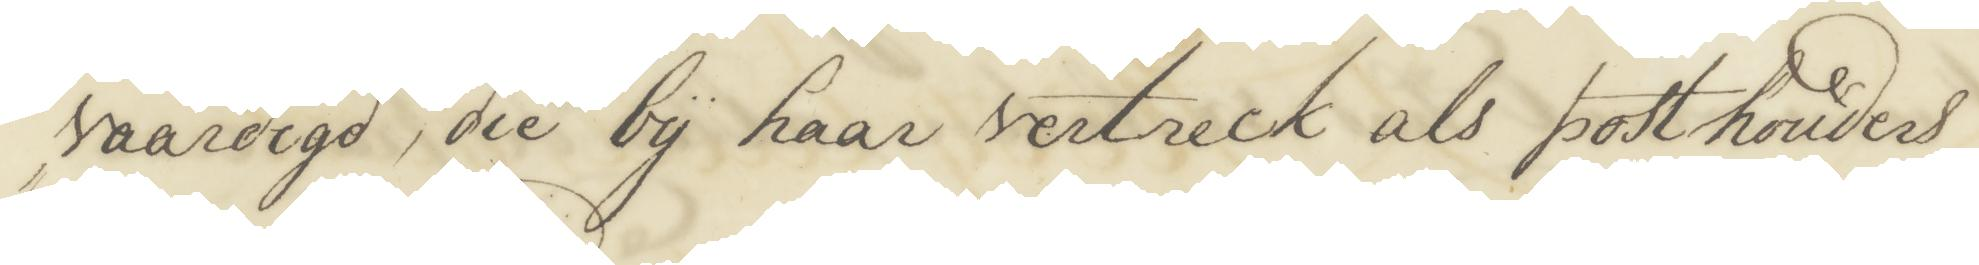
„vaardigd, die bij haar vertreck als posthouders
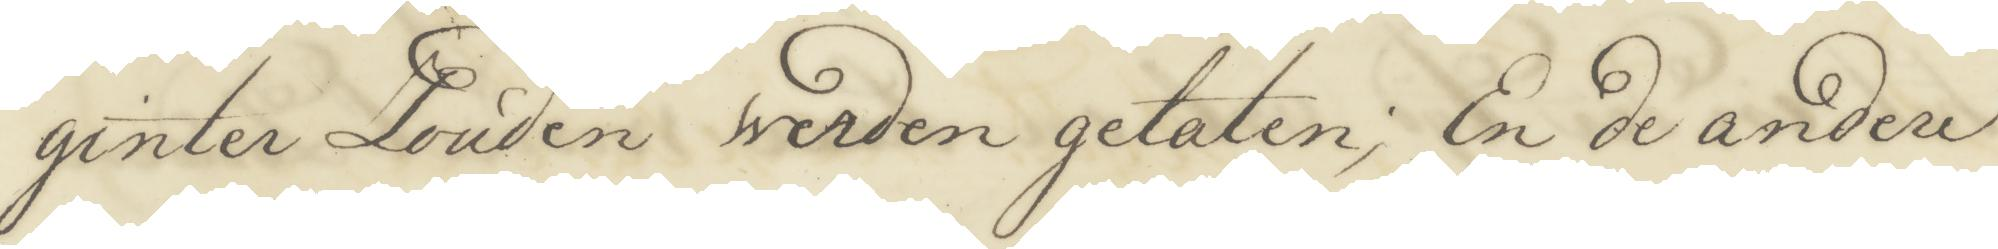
ginter zouden werden gelaten; En de andere
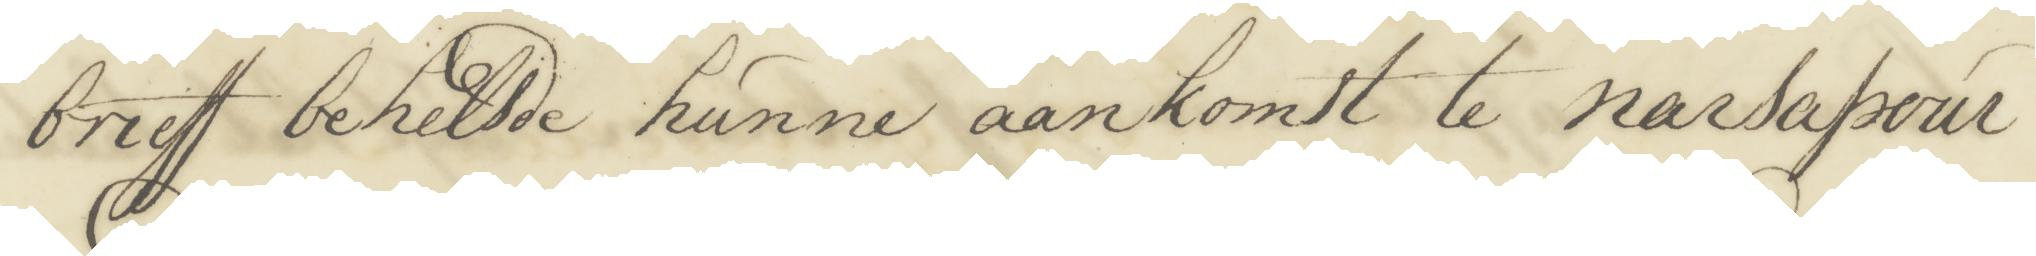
brieff behelsde hunne aankomst te narsapour
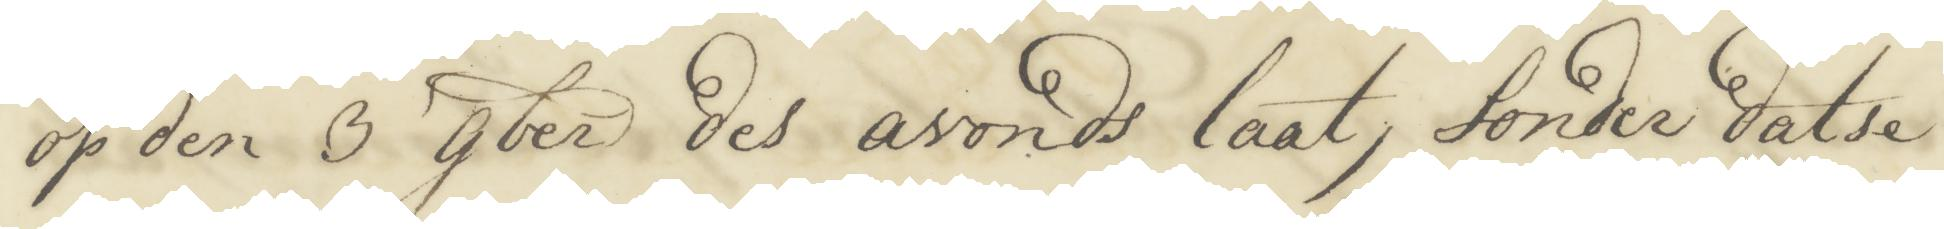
op den 3 gber des avonds laat, sonder datse
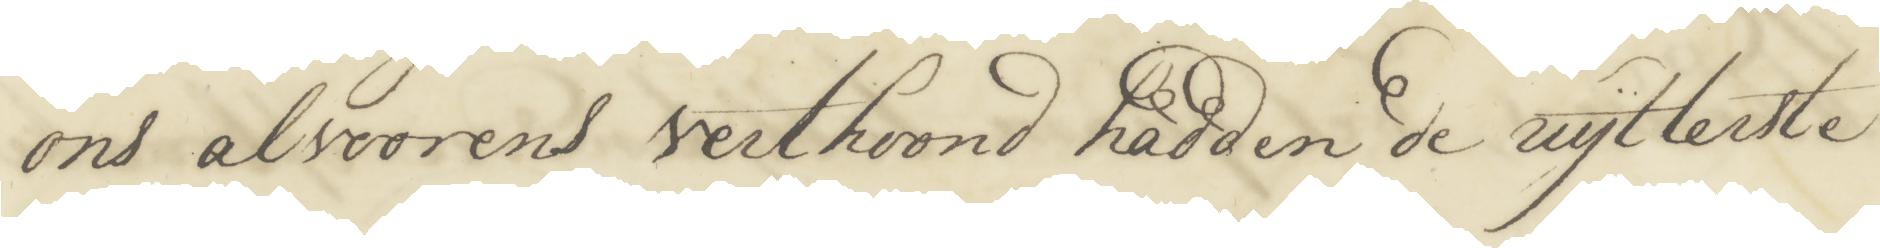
ons alvoorens verthoond hadden de uijtterste
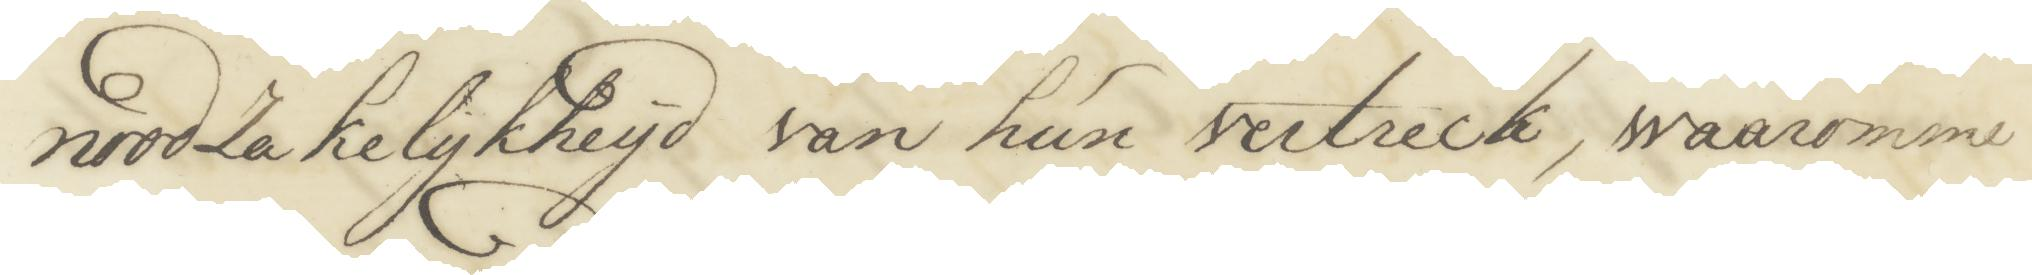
noodzakelijkheijd van hun vertreck, waaromme
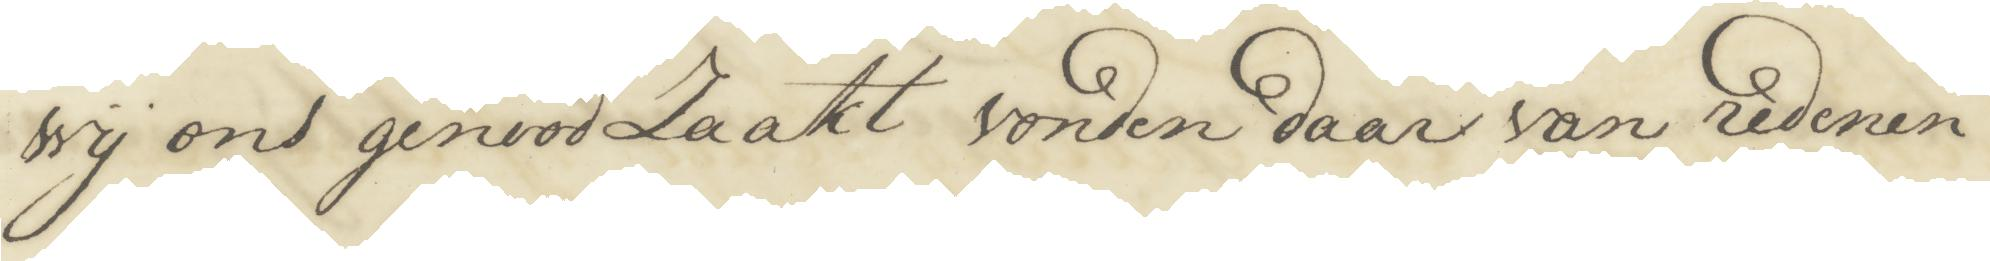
wij ons genoodzaakt vonden daar van redenen
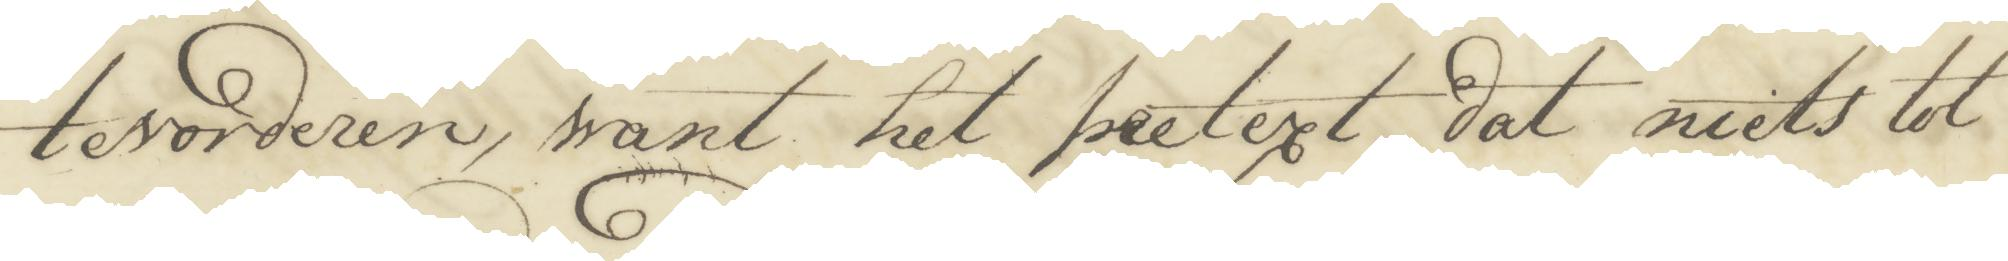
tevorderen, want het pretext, dat niets tot
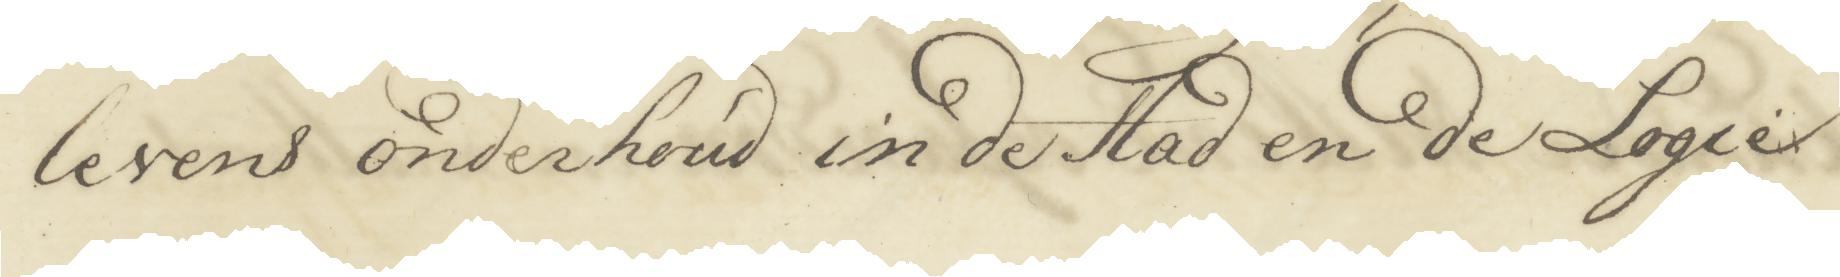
levens onderhoud in de stad en de Logie
